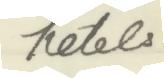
ketels
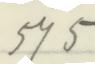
575
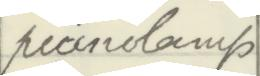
pianolamp
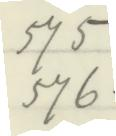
576
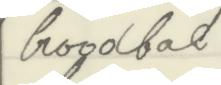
broodbak
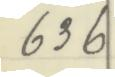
636
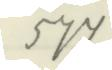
577
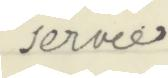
servie
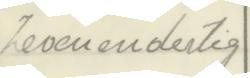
zeven en dertig
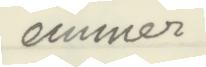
emmer
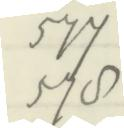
578
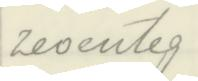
zeventeg
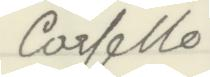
Cassette
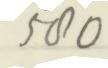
580
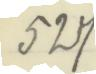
527
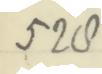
528
